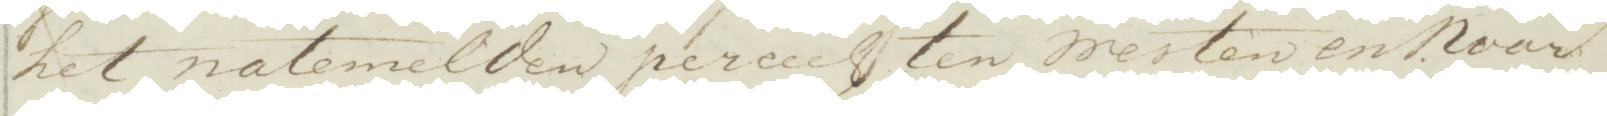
het natemelden perceel ten westen en Noor
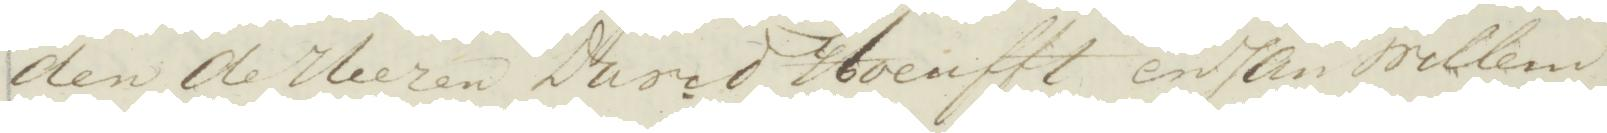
den de Heeren David Hoeufft enJan Willem
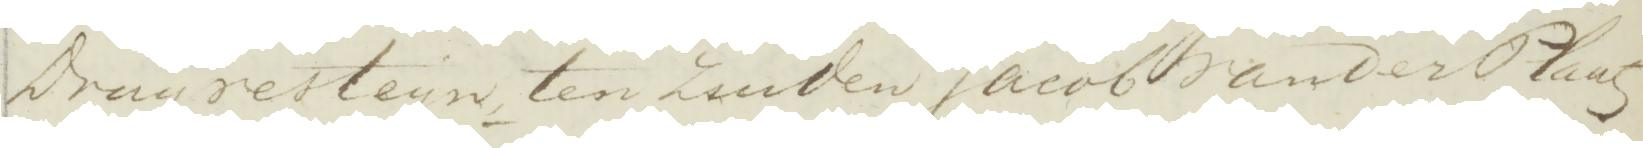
Druyvesteyn, ten zuiden Jacob vanderPlaat
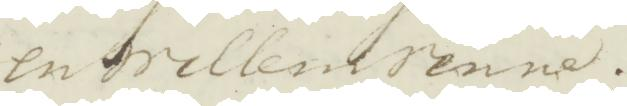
en Willem Venne.
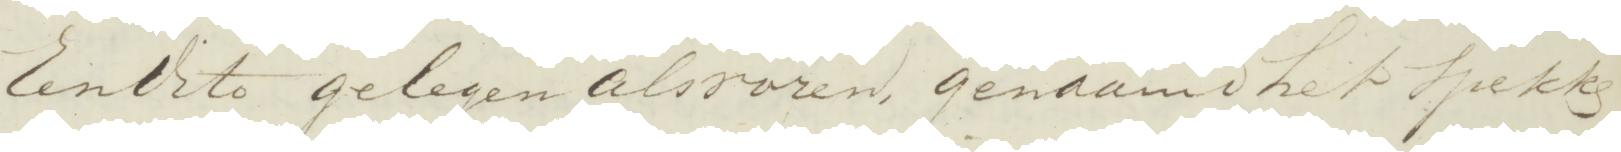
Een dito gelegen als voren, genaamd het spekke
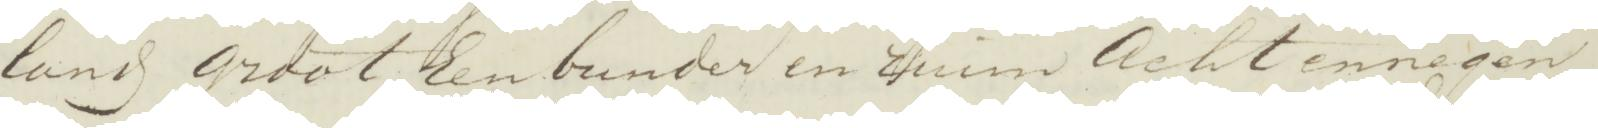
land groot Een bunder en ruim Acht ennegen
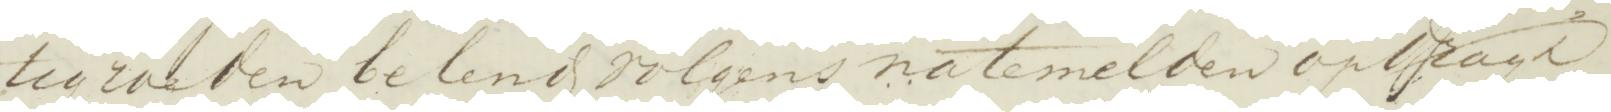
tig roeden belend volgens natemelden op dragt
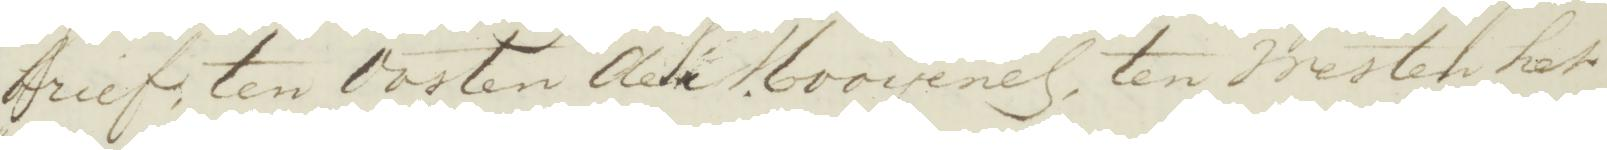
brief, ten Oosten den Mooijenel, ten Westen het
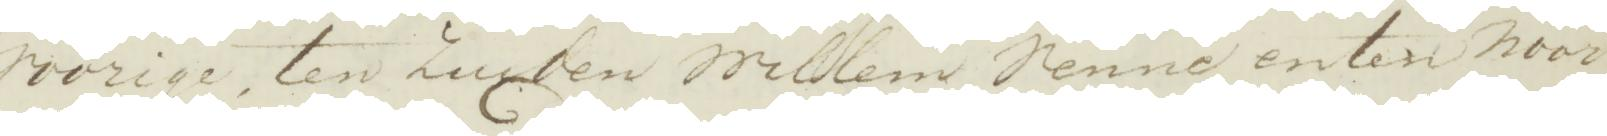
voorige, ten zuiden Willem Venne enten Noor
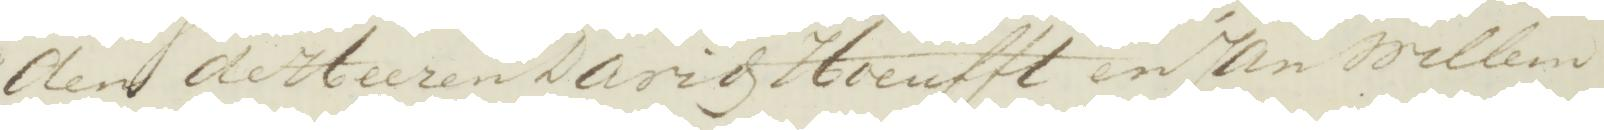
den deHeeren David Hoeufft en Jan Willem
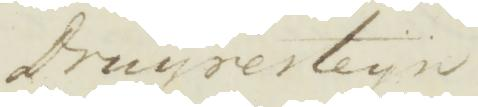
Druijvesteijn
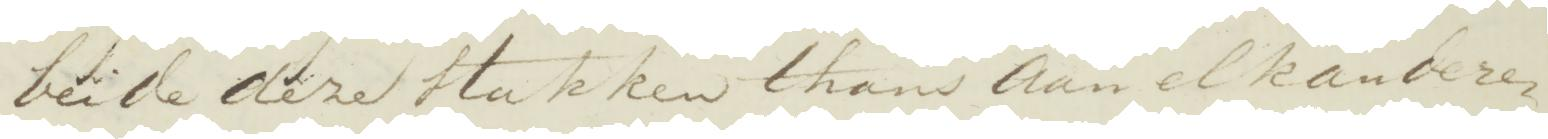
beide deze stukken thans aan elk anderen
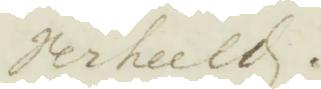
verheeld
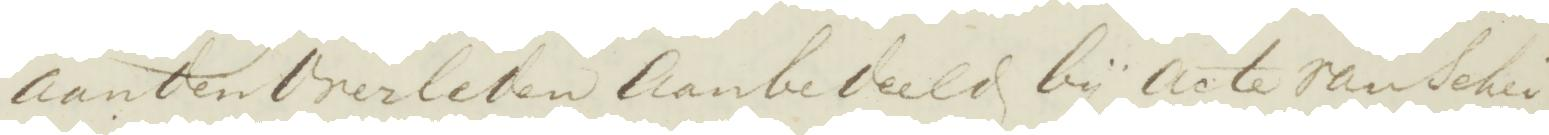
aan den Overleden Aanbedeeld bij acte vanschei
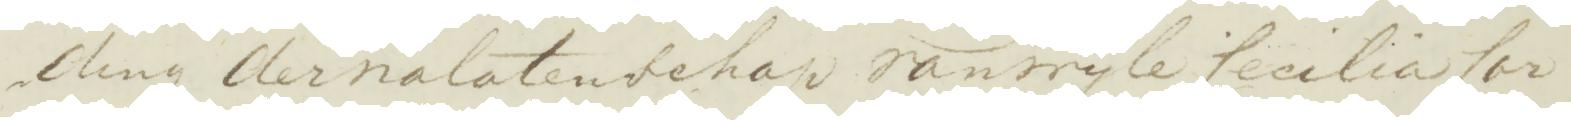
„ding dernalatenschap vanwijle Cecilia Cor
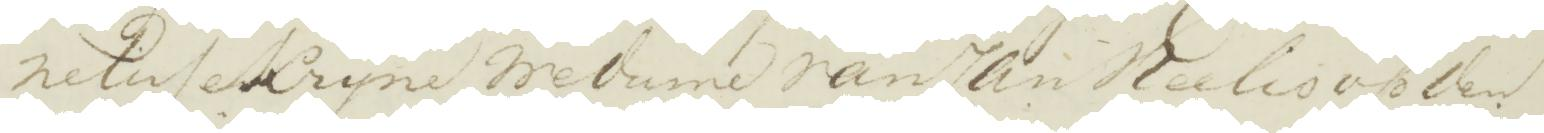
nelisse Krijne Weduwe van Jan Neelis op den
